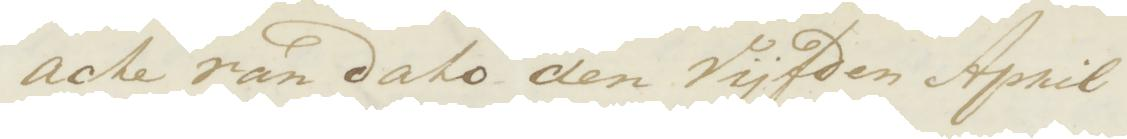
acte van dato den Vijfden April
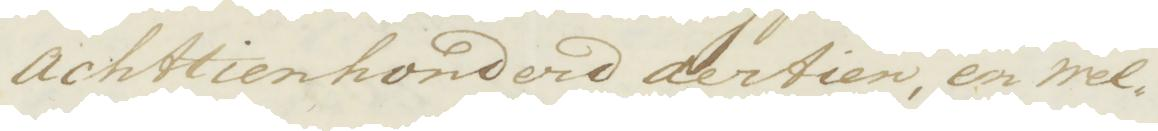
achttienhonderd dertien, en wel„
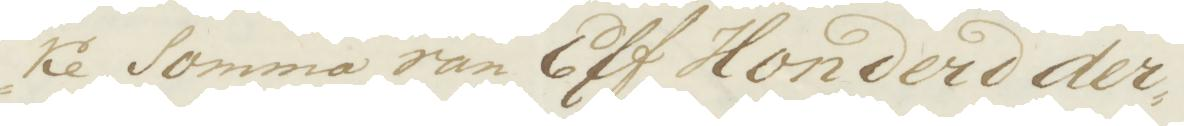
=ke somma van Elf Honderd der=
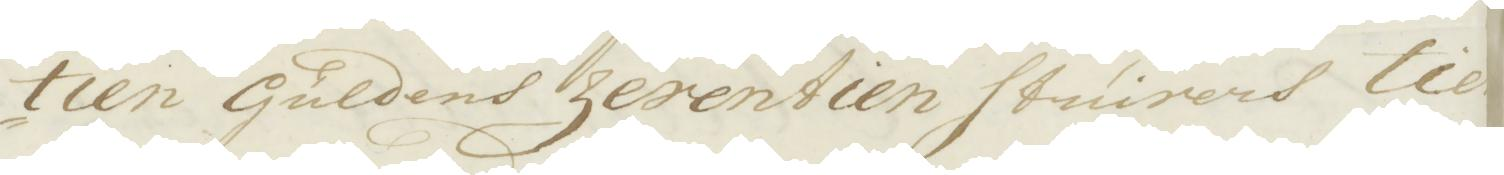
=tien Guldens zeventien stuivers tie
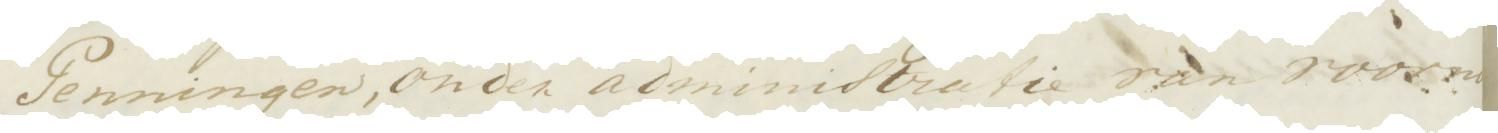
Penningen, onder administratie van voorno
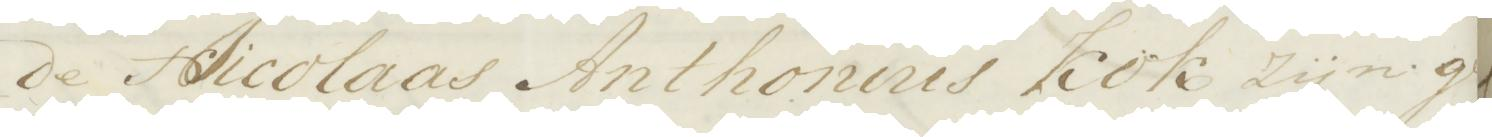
de Nicolaas Anthonius Kok zijn g
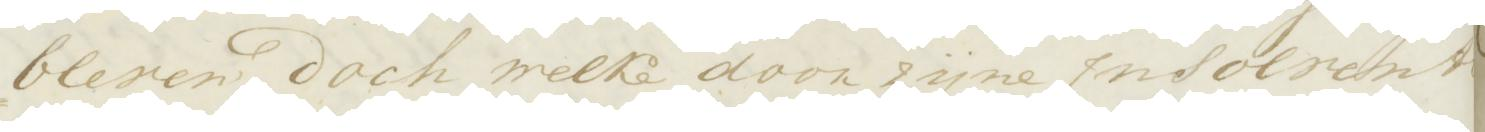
=bleven, doch welke door zijne Insolvent
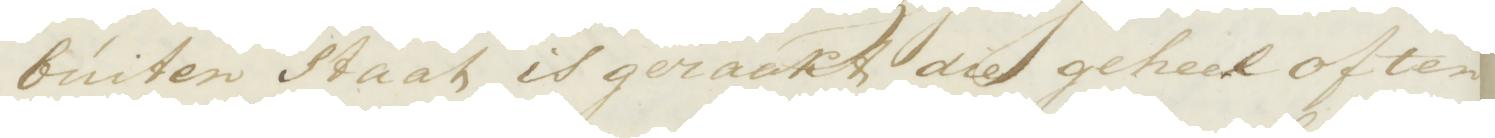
buiten staat is geraakt die geheel of ten
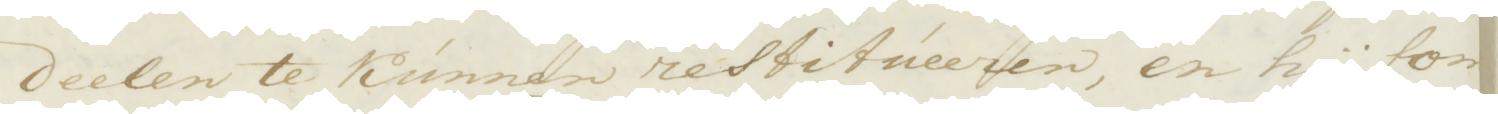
deelen te kunnen restitueeren, en hij Con
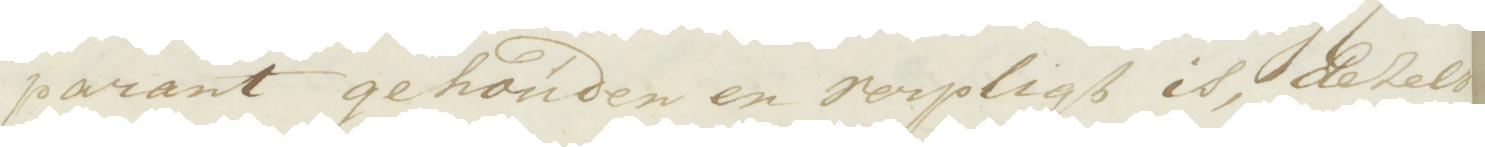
=parant gehouden en verpligt is, dezel
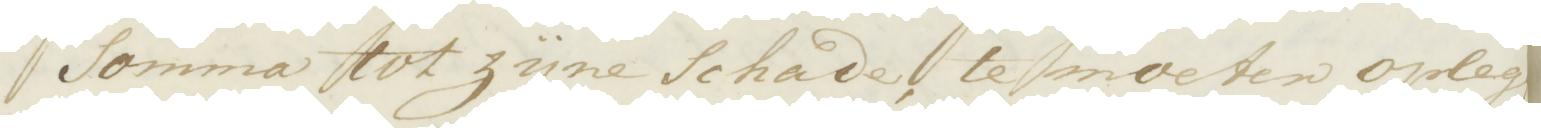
somma tot zijne schade, te moeten opleg
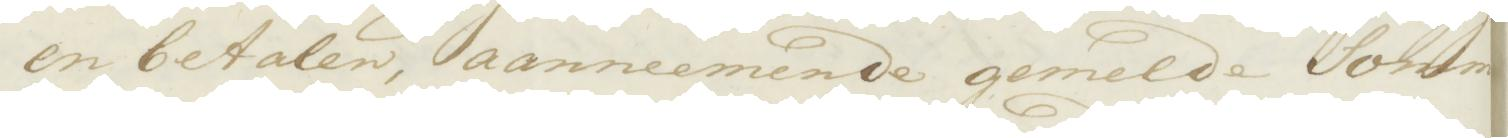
en betalen, aanneemende gemelde somm
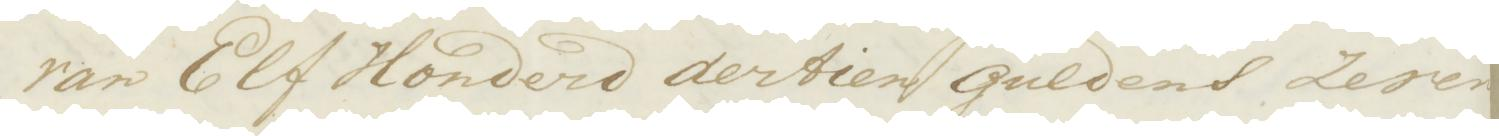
van Elf Honderd dertien guldens Zeven
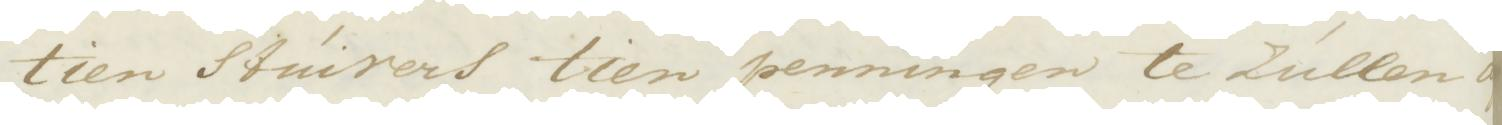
=tien stuivers tien penningen te zullen
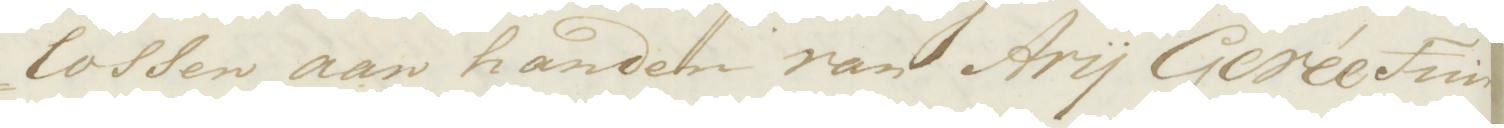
=lossen aan handen van Arij Geree Tui
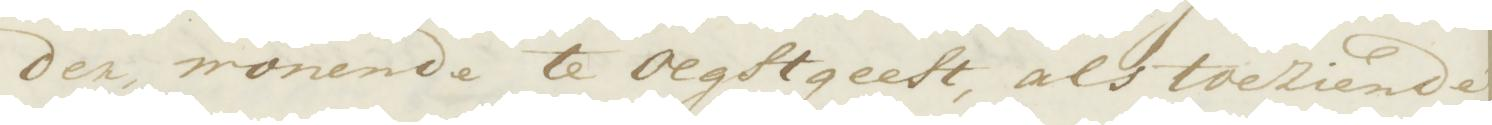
der, wonende te Oegstgeest, als toeziende
